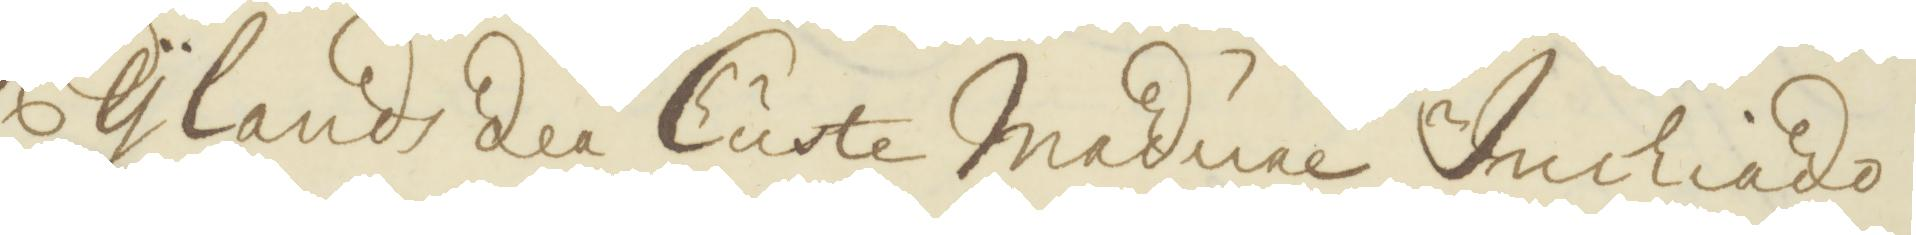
Eijlands der Custe Madure Inchiado
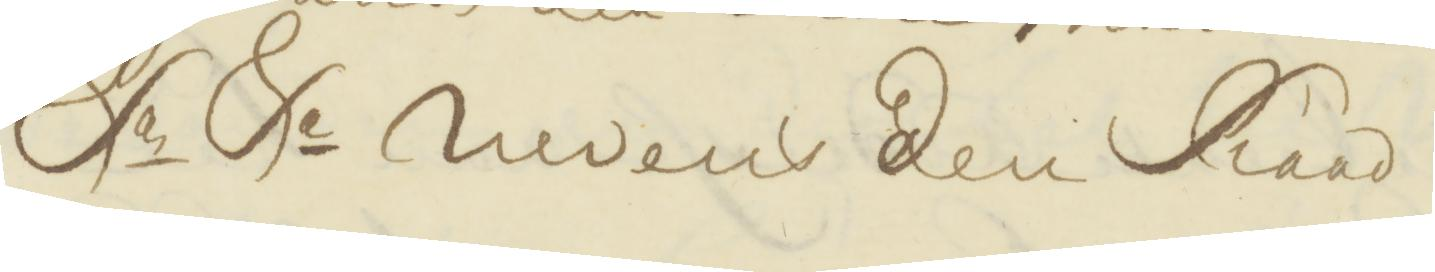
&=a &=a nevens den Raad
